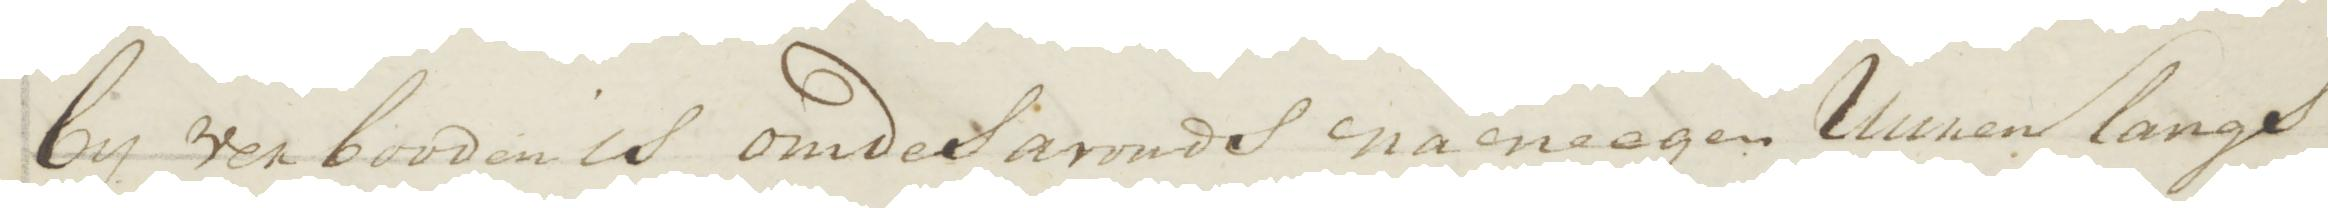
bij verbooden is om des avonds na neegen uuren langs
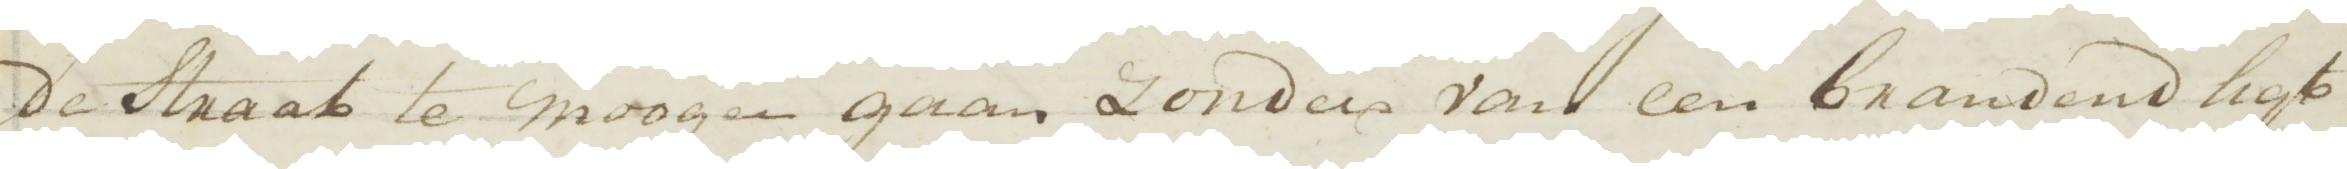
de straat te moogen gaan zonder van een brandend ligt
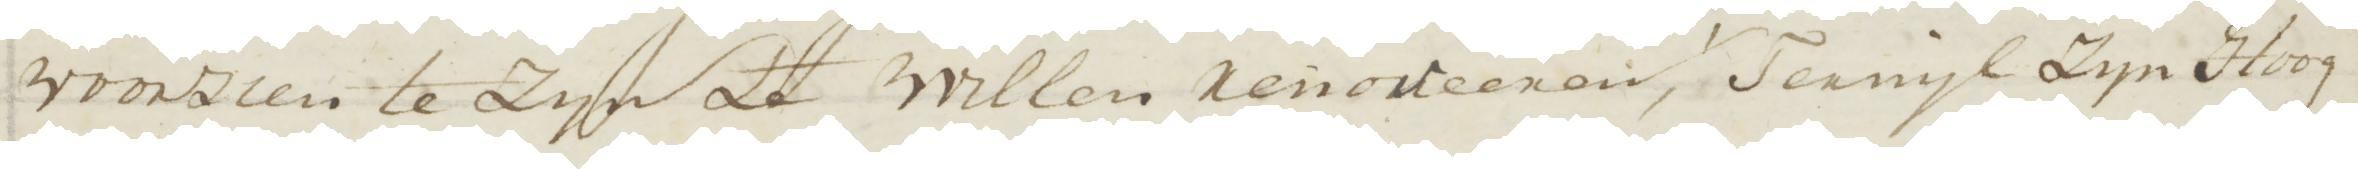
voorzien te zyn te willen renoveeren, Terwijl zyn Hoog
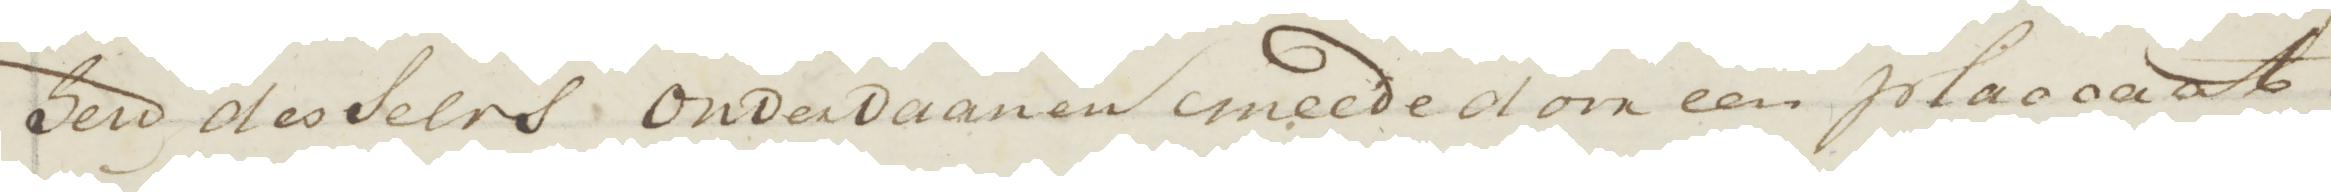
heid desselvs onderdaanen meede door een placcaat
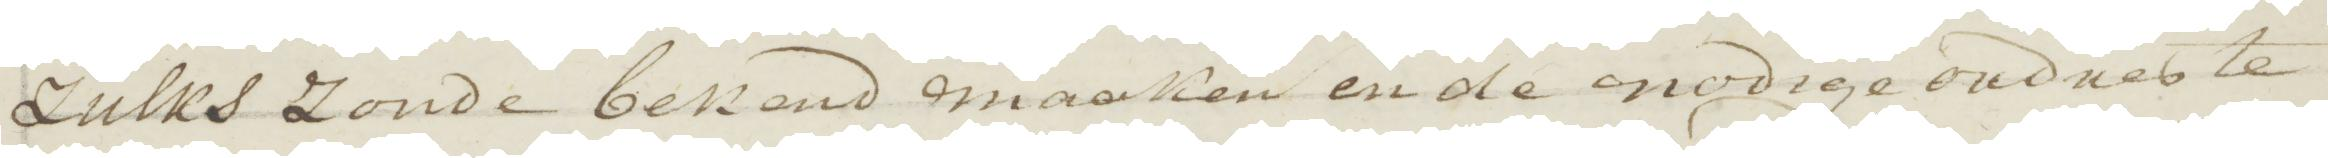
zulks zoude bekend maaken en de nodige ordres te
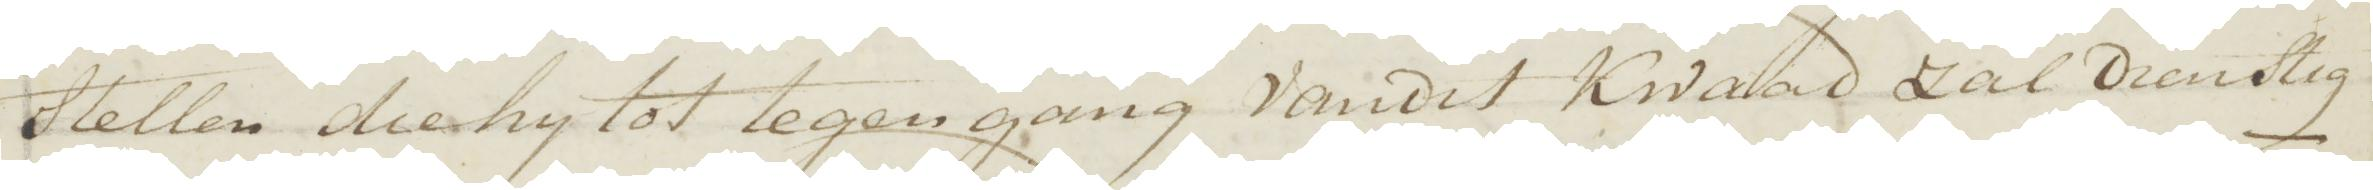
stellen die hy tot tegengang van dit kwaad zal dienstig
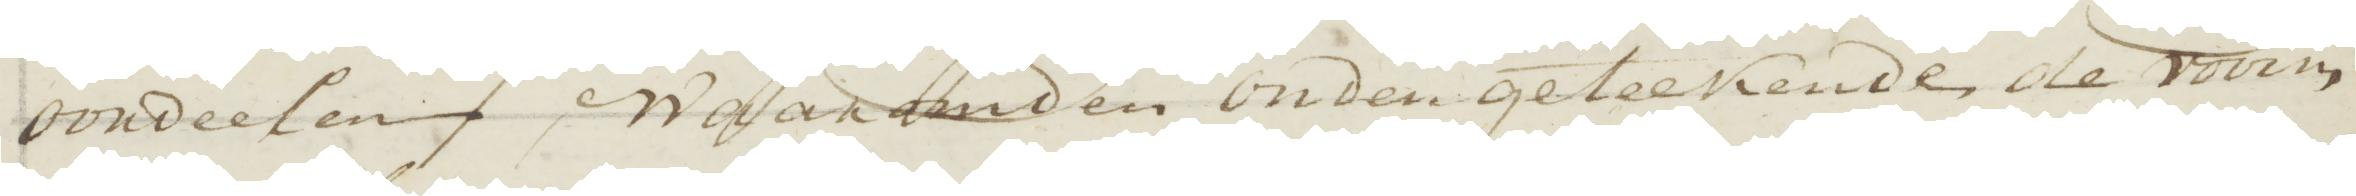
oordeelen, waarom den ondergeteekende de voorm
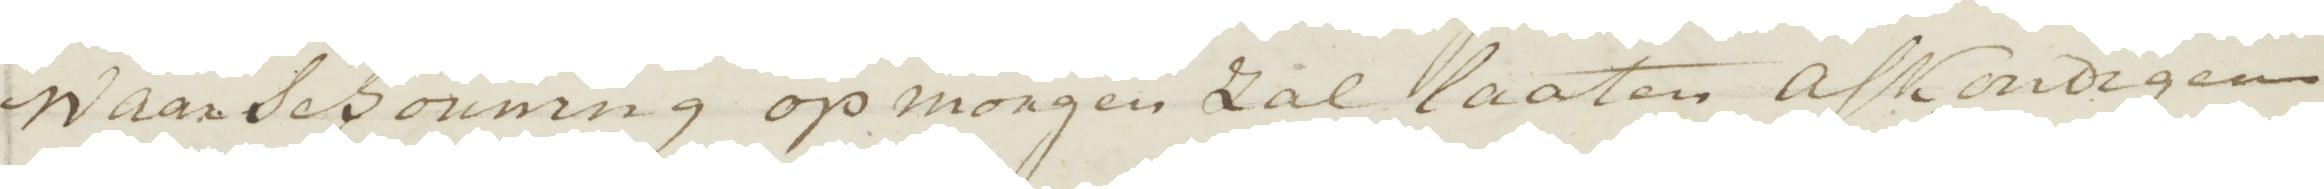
waarschouwing op morgen zal laaten afkondigen
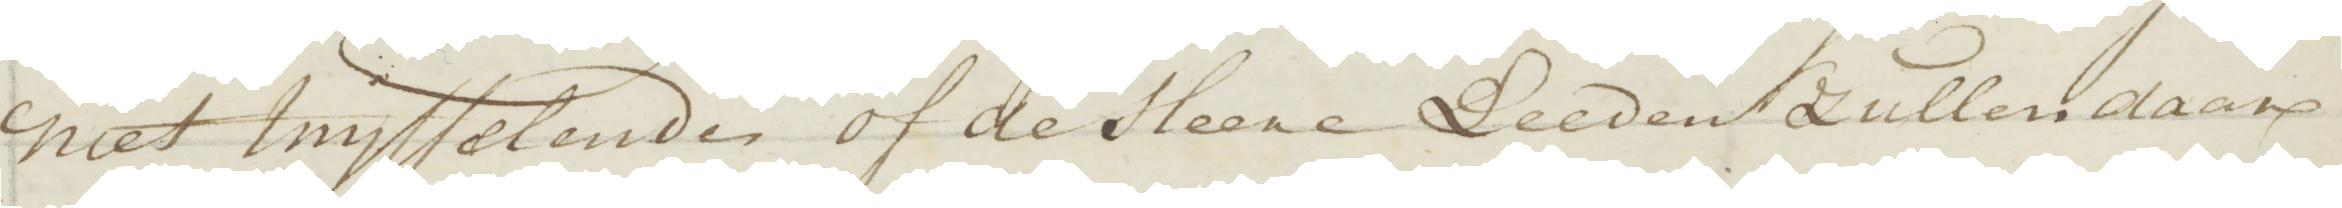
niet twijffelende of de Heere Leeden zullen daar
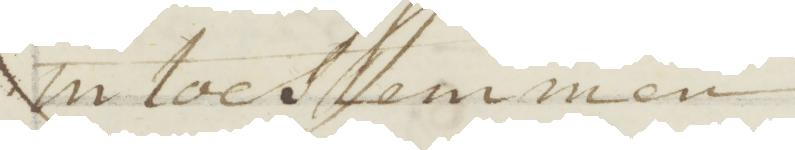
in toestemmen
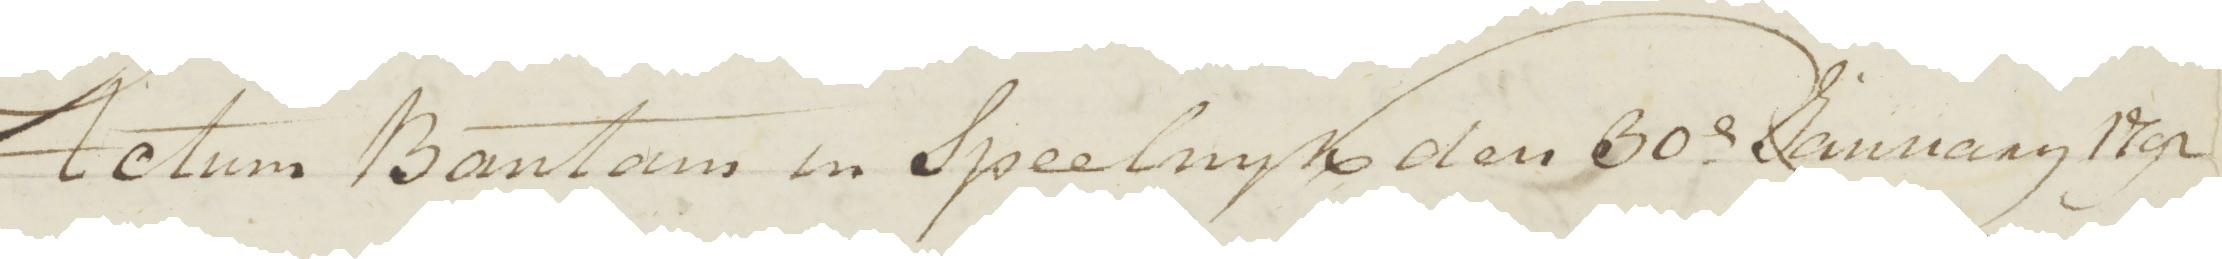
Actum Bantam in speelwyk den 30.en January 1792
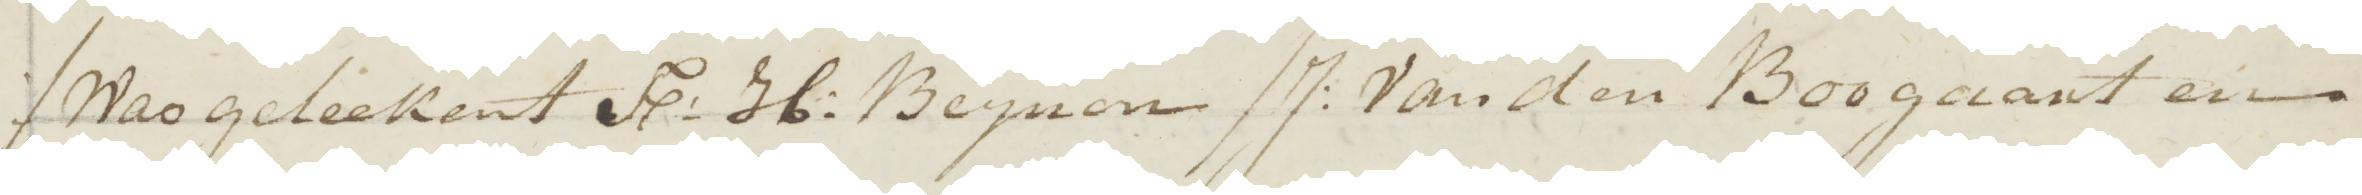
:/Was geteekent F: H: Beijnen / J: van den Boogaart en
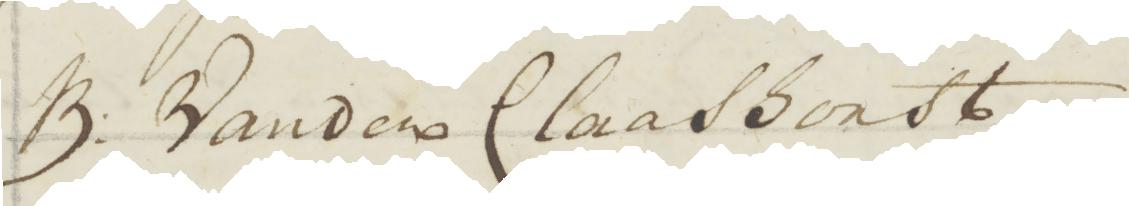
B: vander Claashorst – .
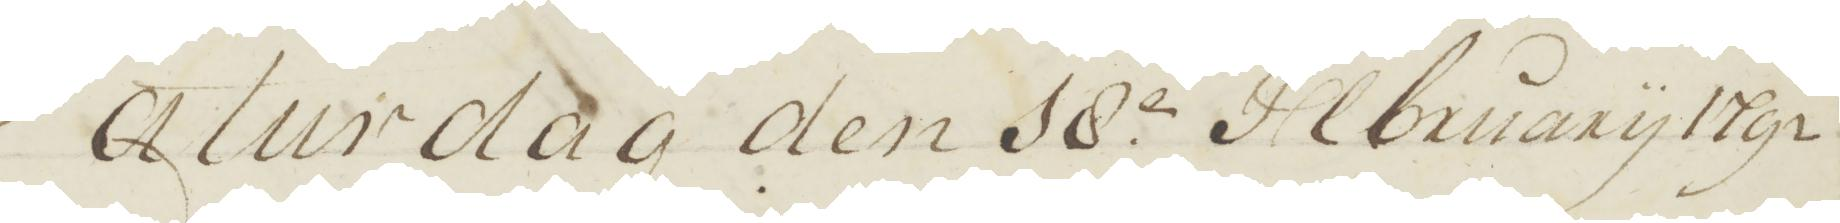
Saturdag den 18.e Februarij 1792
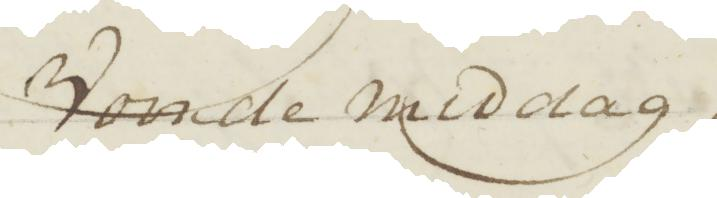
Voor de middag
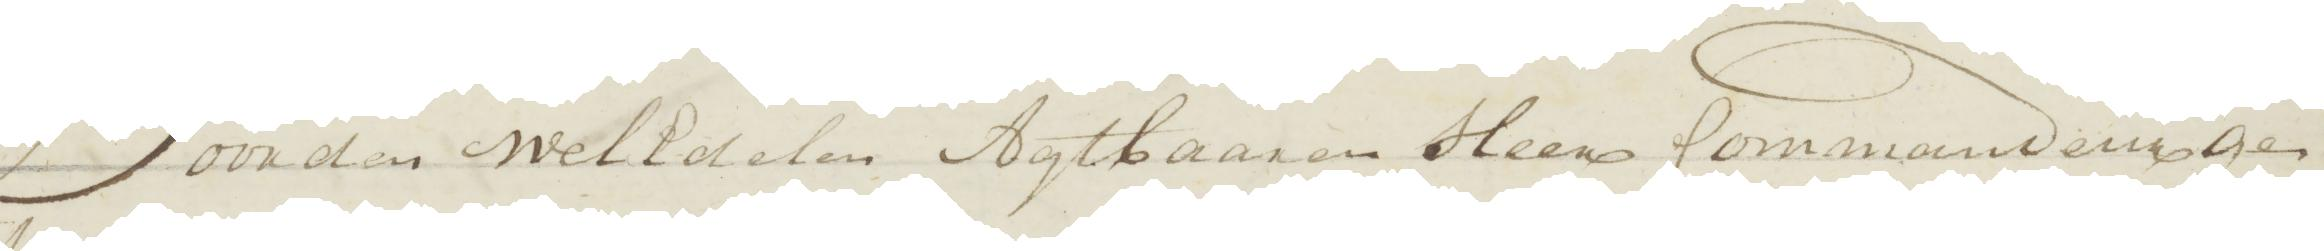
Door den welEdelen Agtbaaren Heer Commandeur ge
